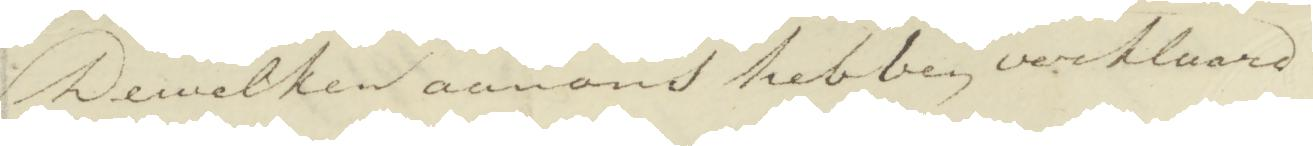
Dewelken aan ons hebben verklaard
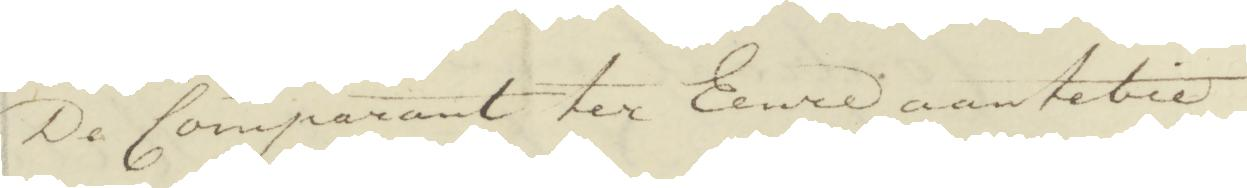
De Comparant ter Eenre aan tebie
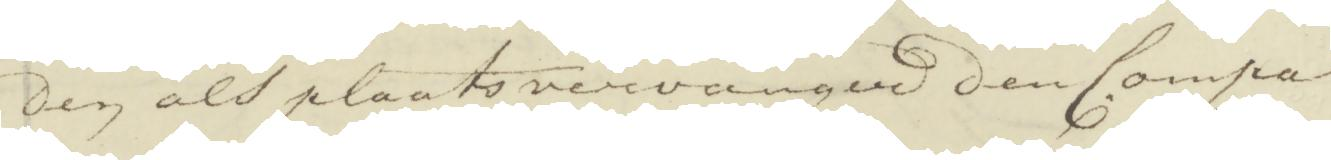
den als plaatsvervanger den Compa
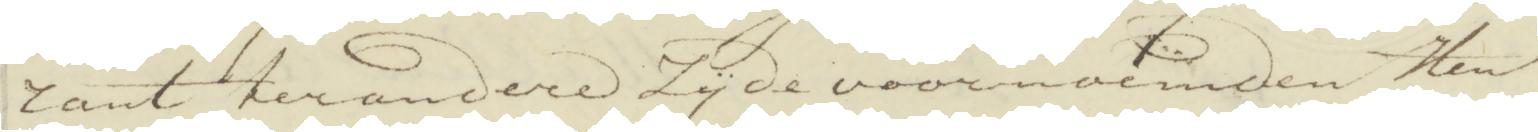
rant ter andere zijde voornoemden Hen
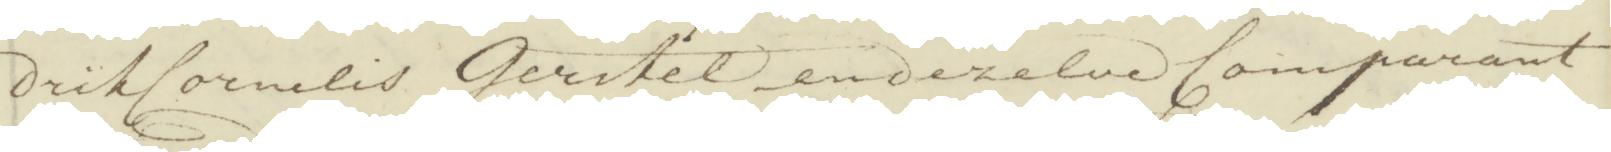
drik Cornelis Gerstel en dezelve Comparant
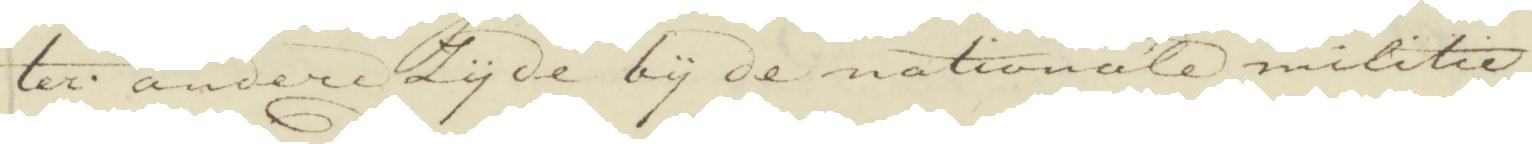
ter andere zijde bij de nationale militie
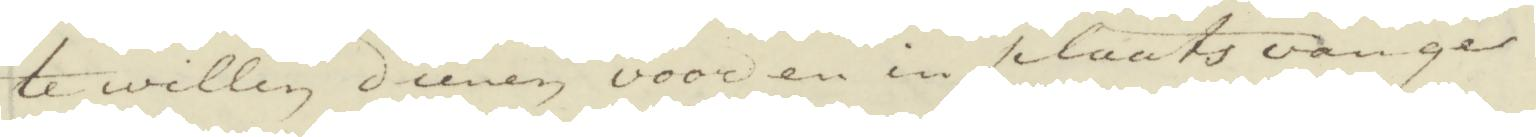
te willen dienen voor en in plaats van ge
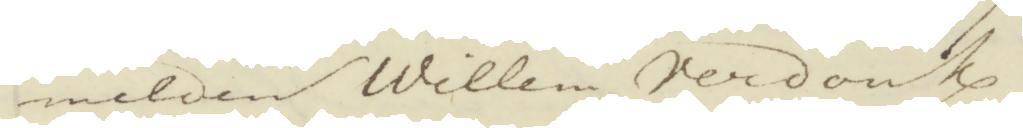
melden Willem Verdonk
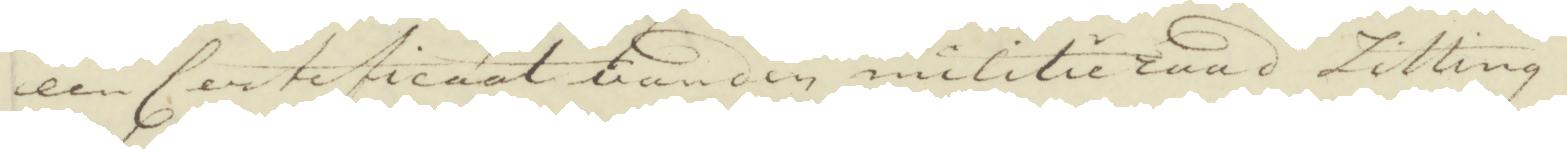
een Certificaat van den militie raad zitting
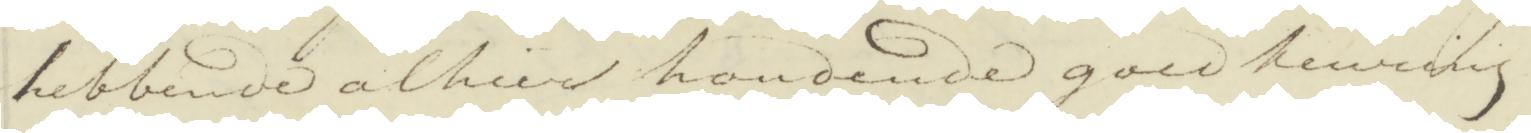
hebbende alhier houdende goed keuring
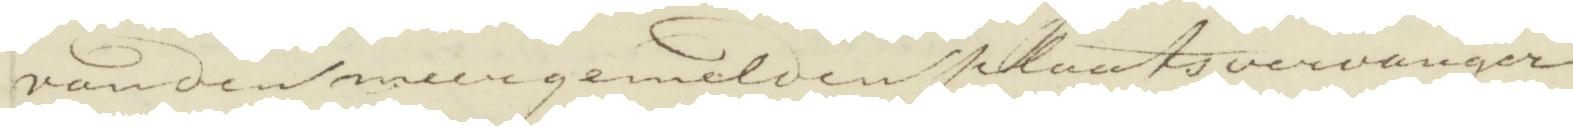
vanden meergemelden plaats vervanger
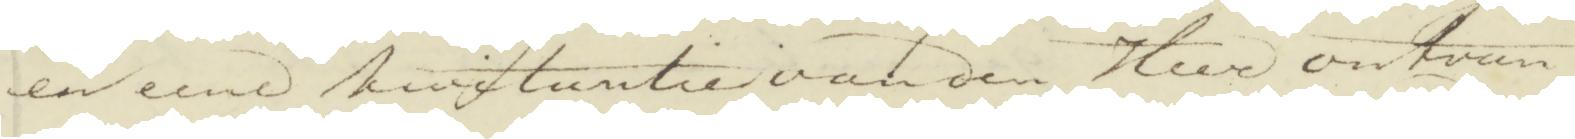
en eene kwitantie van den Heer ontvan
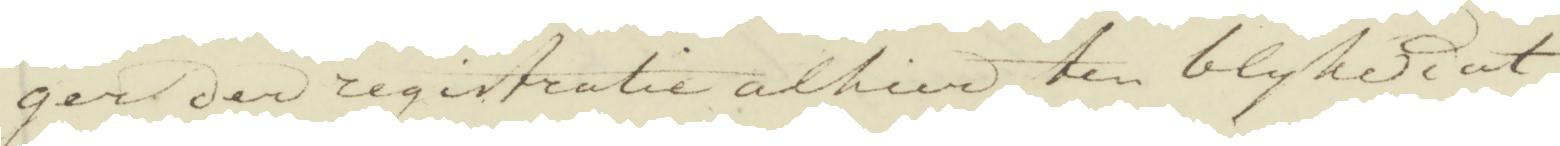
ger der registratie alhier, ten blyke dat
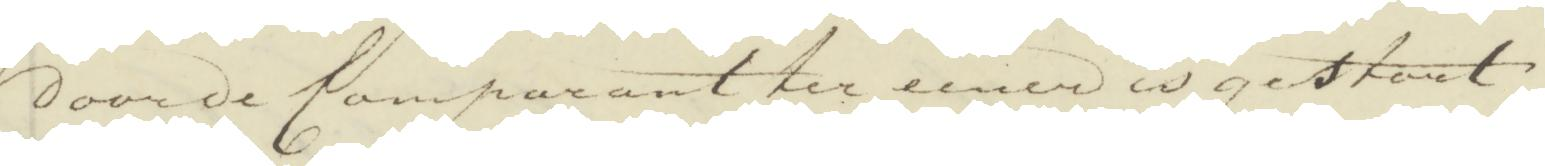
door de Comparant ter eener is gestort
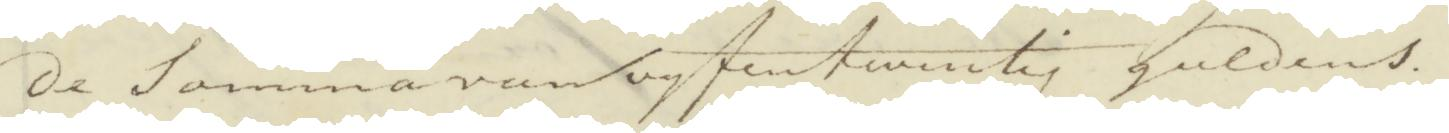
de somma van vyfentwintig guldens.
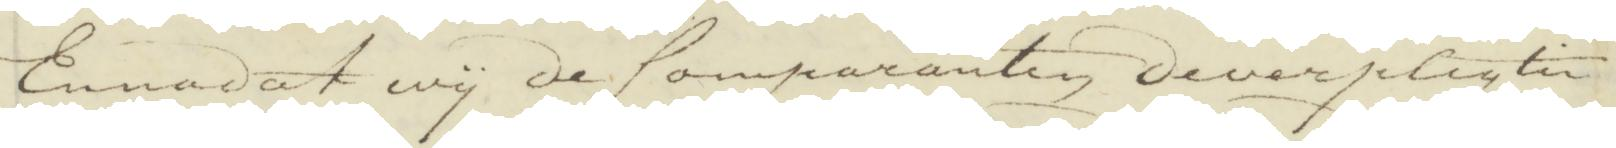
Ennadat wij de Comparanten deverpligtin
